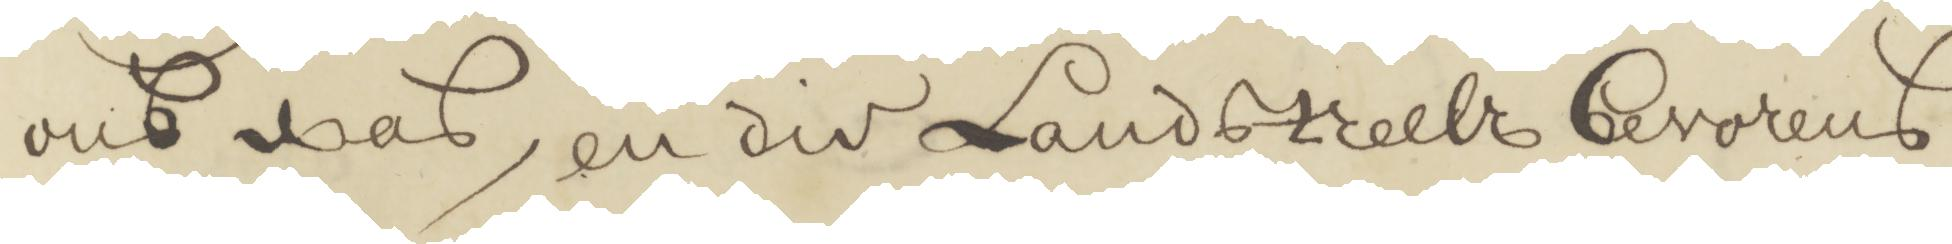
ons was, en die Landstreek bevorens
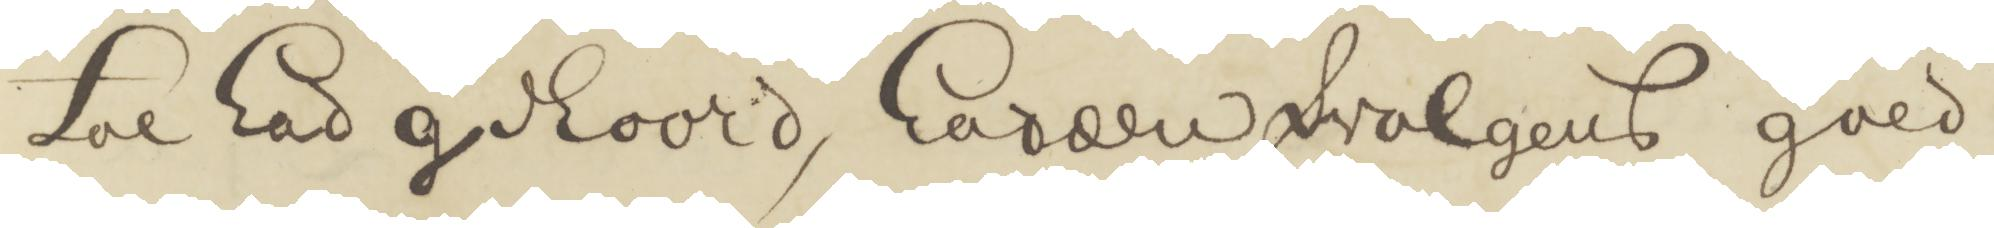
toe had gehoord, hadden vervolgens goed
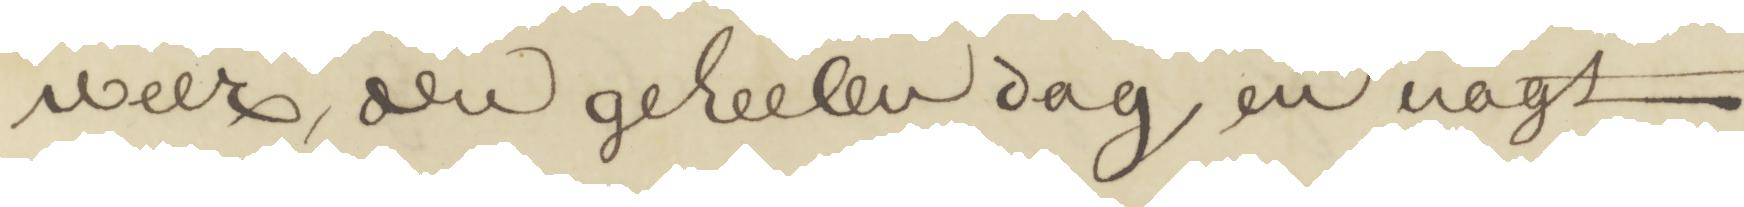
weer, den geheelen dag, en nagt
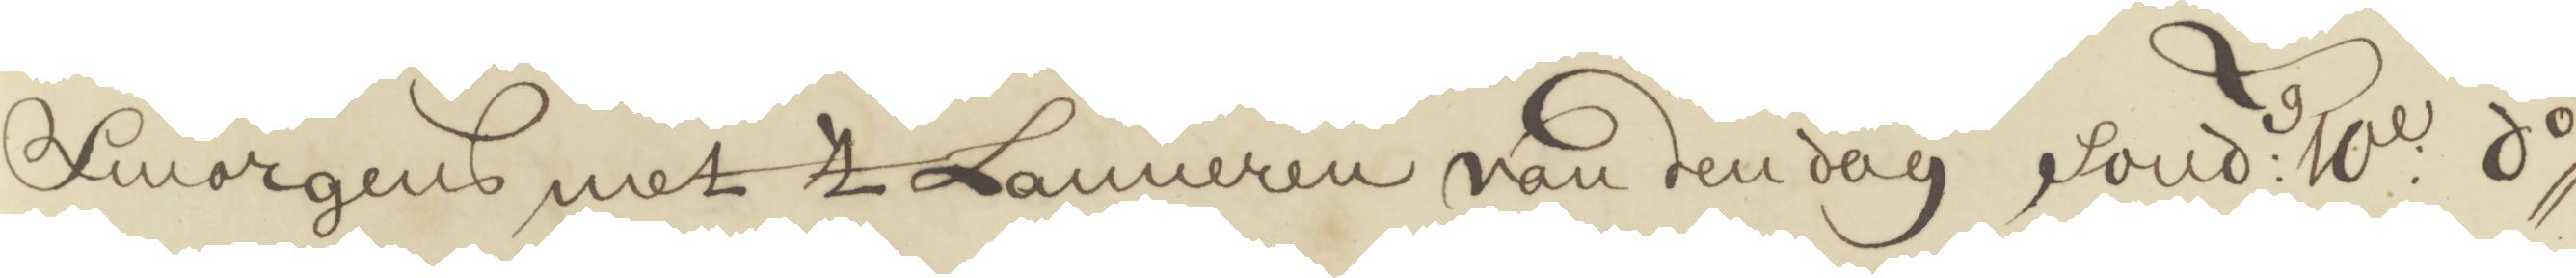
Smorgens met ’t Lamieren van den dag sond:g 10:e d„o
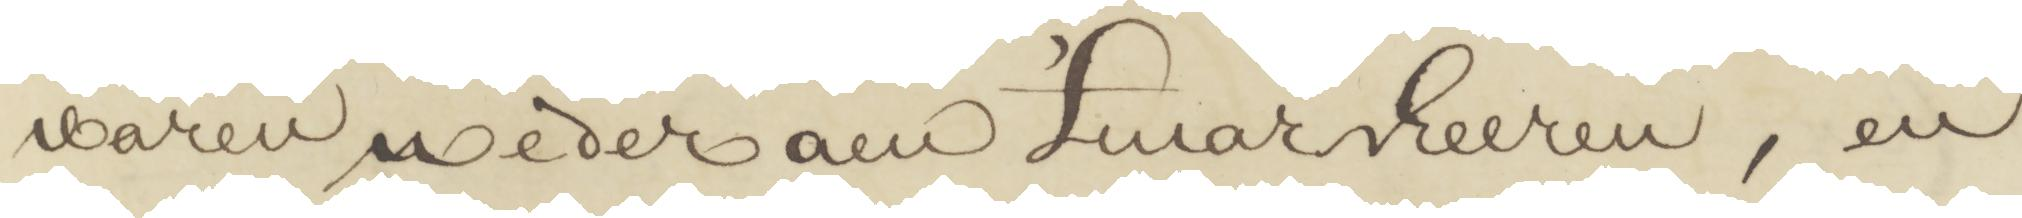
waren weder aen 'tmarcheeren, en
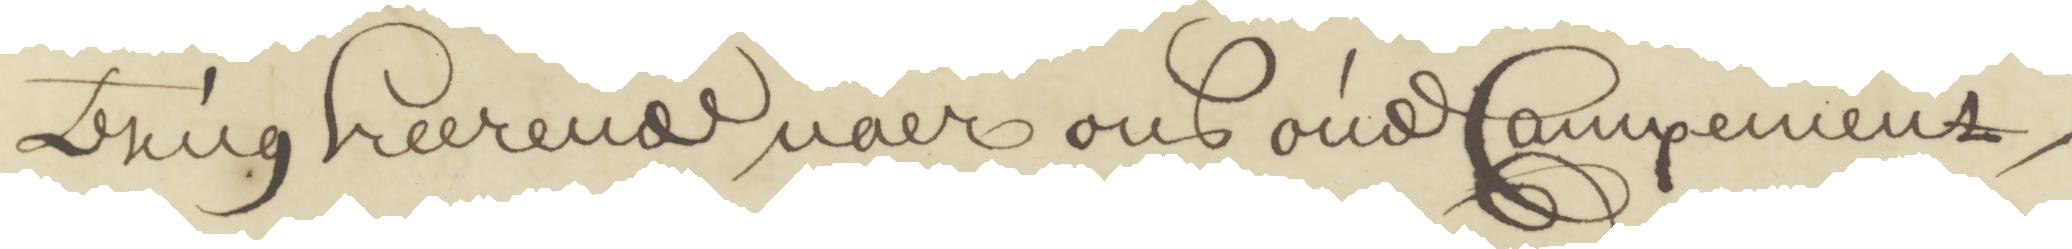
terug keerende naer ons oude Campement,
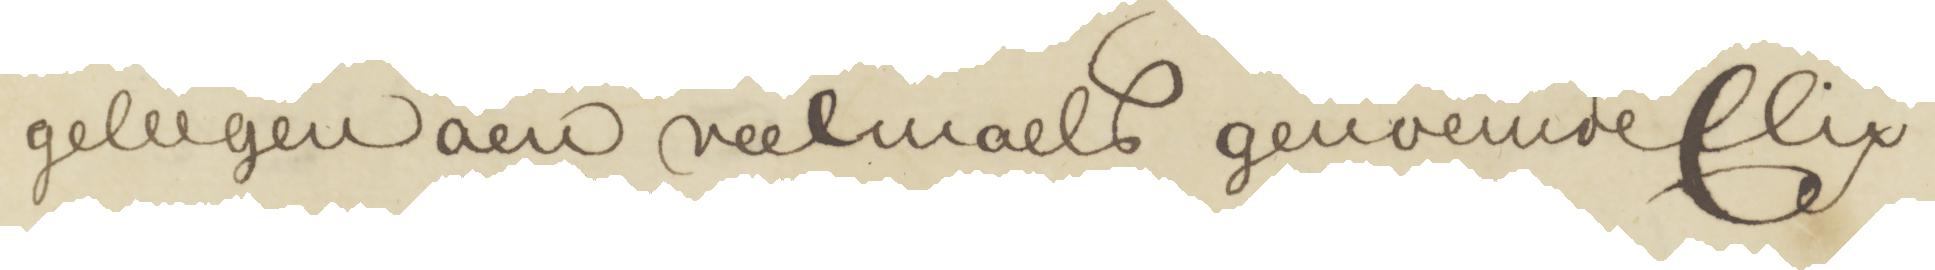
geleegen aen veelmaels genoemde Clip
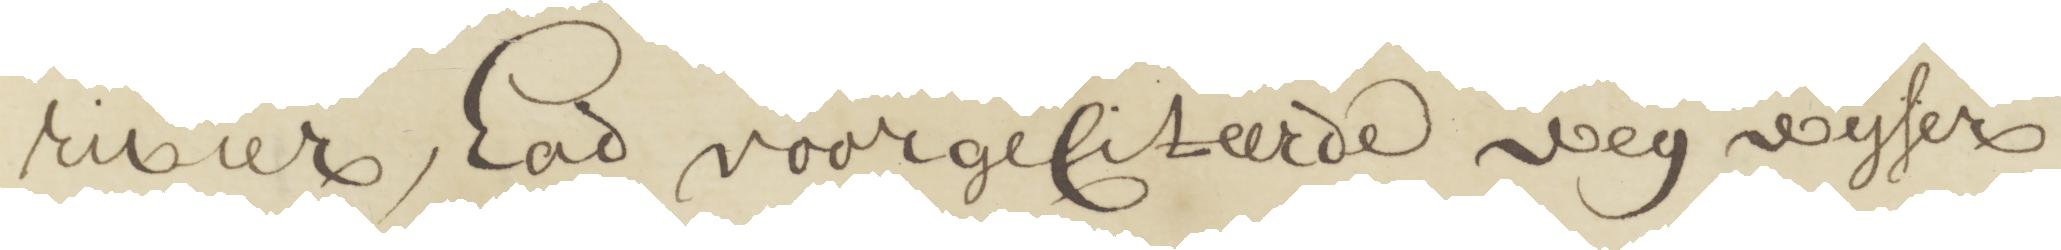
rivier, had voorgeciteerde weg wijser
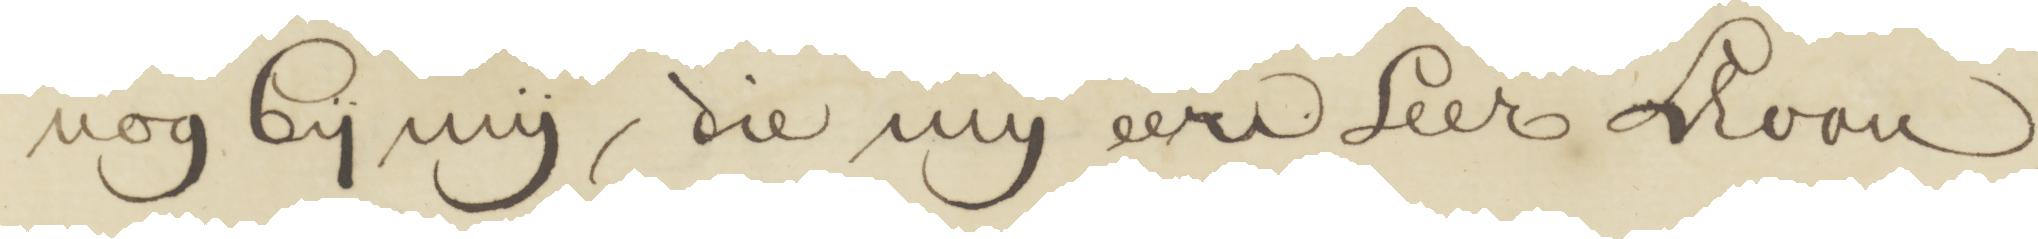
nog bij mij, die mij een seer schoon
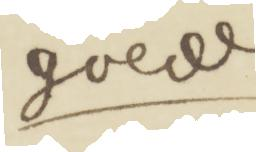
goede
